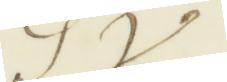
JV
